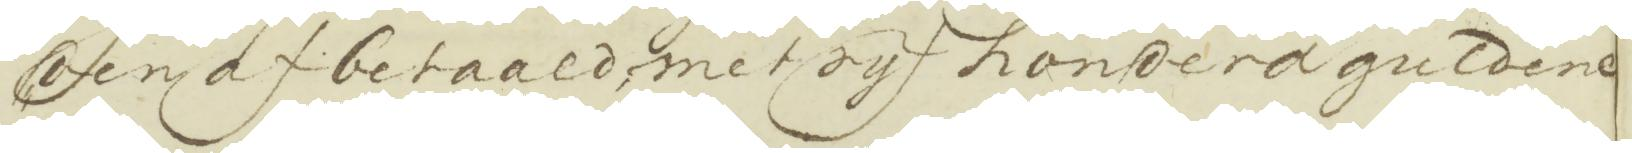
den afbetaald, met vyf honderd guldens
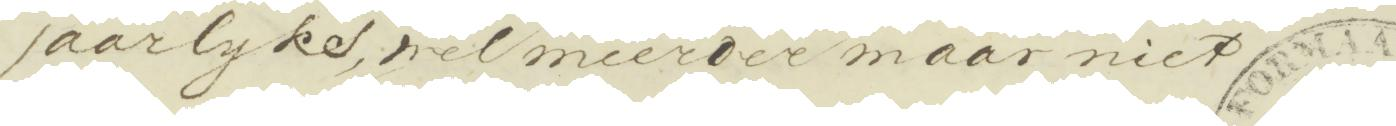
jaarlyks, wel meerder maar niet
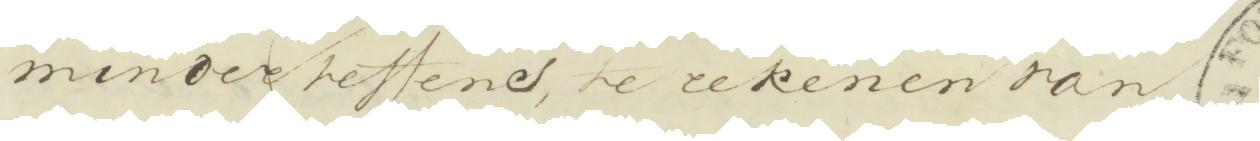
minder teffens, te rekenen van
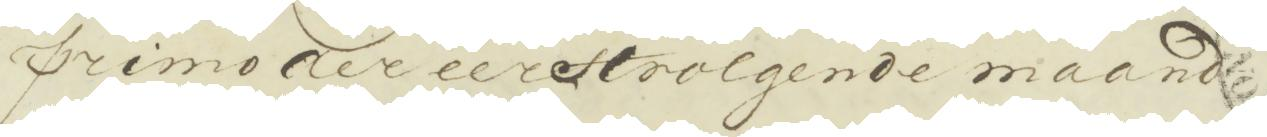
primo der eerstvolgende maand
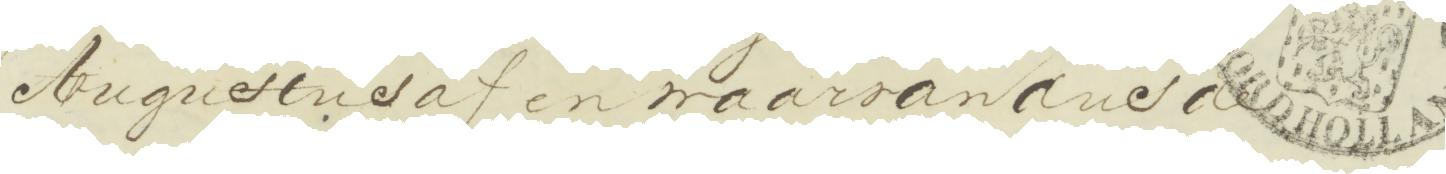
Augustus af en waarvan dus de
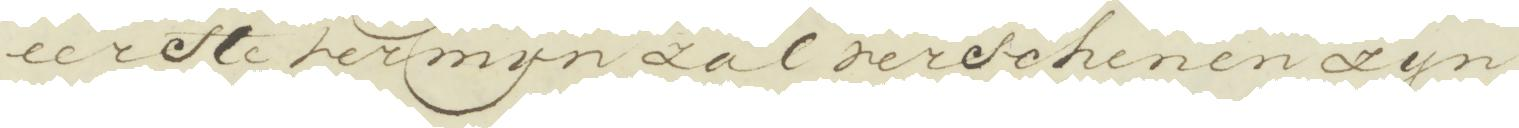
eerste termyn zal verschenen zyn
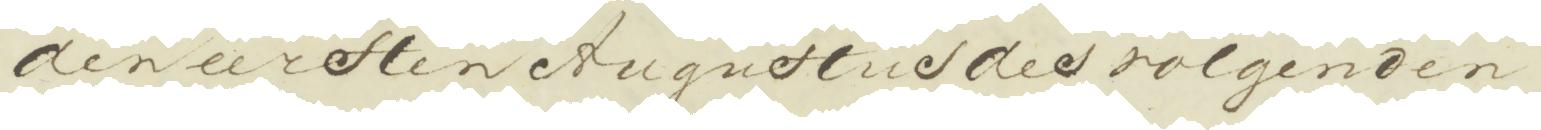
den eersten Augustus des volgenden
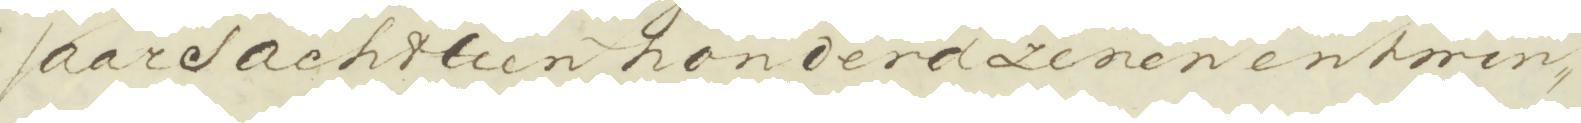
Jaars achttien honderd zeven en twin„
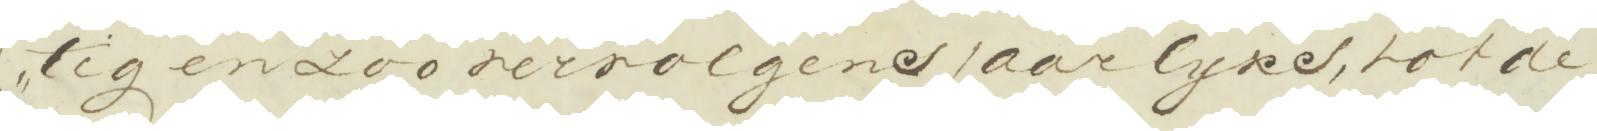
„tig en zoo vervolgens jaarlyks, tot de
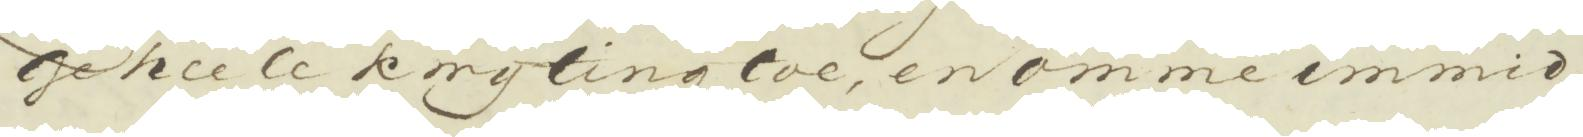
geheele kwyting toe, en omme immid
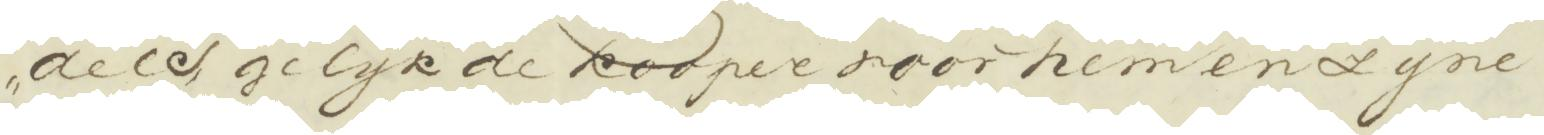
„dels, gelyk de kooper voor hem en zyne
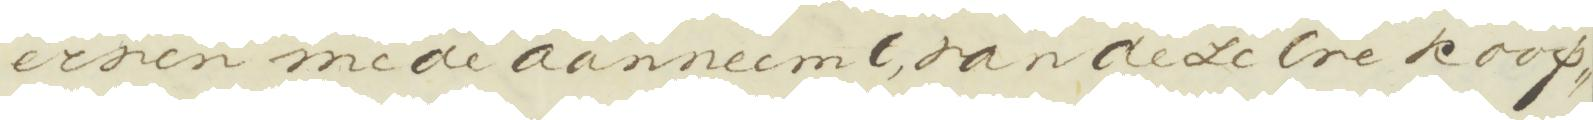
erven mede aanneemt, van dezelve koop„
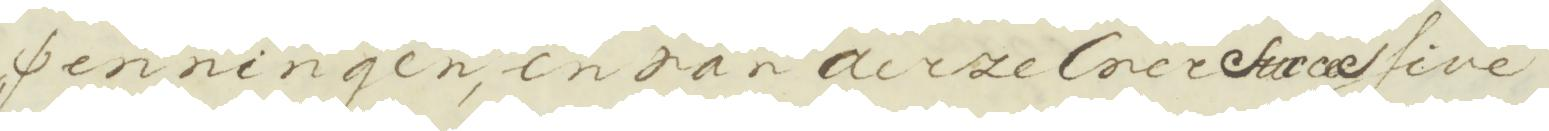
„penningen, en van derzelver successive
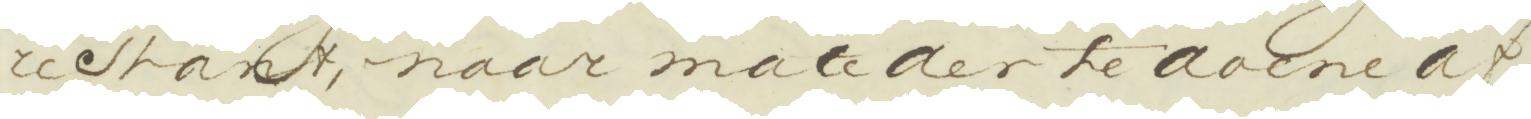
restant, naar mate der te doene af
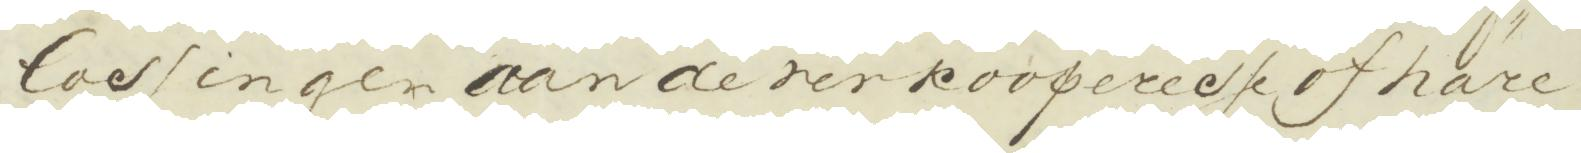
lossingen aan de verkooperesse of hare
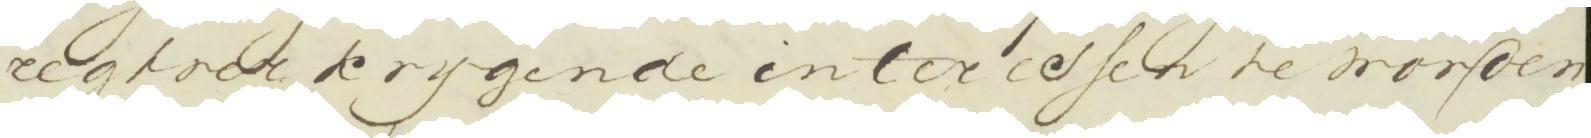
regtverkrygende interessen te worden
